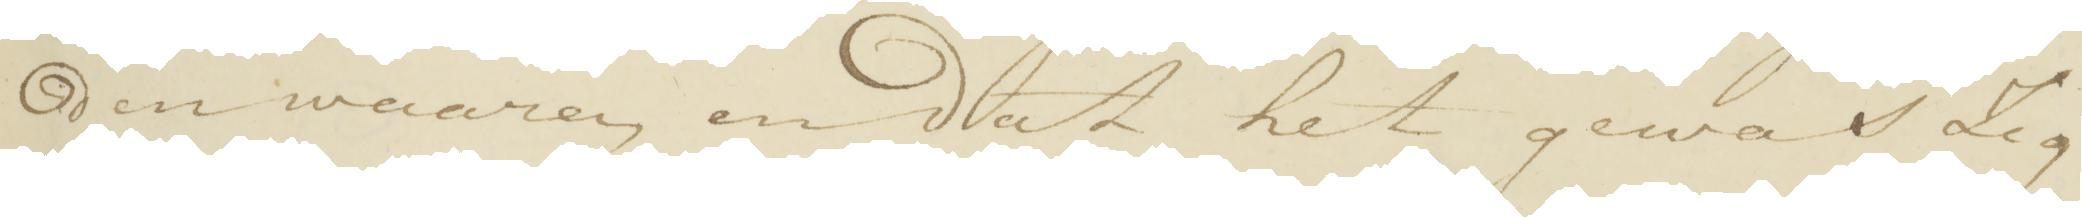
den waaren en dat het gewas zig
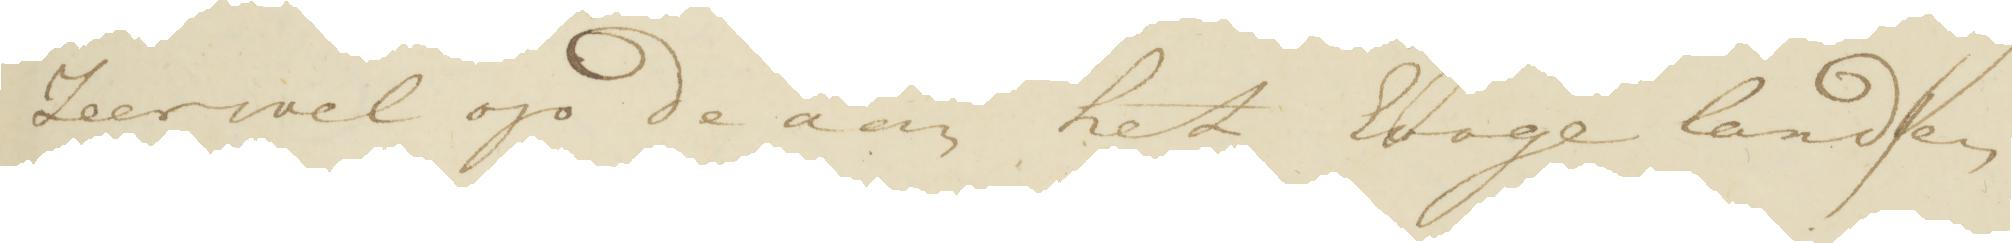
zeer wel op de aan het hooge land, en
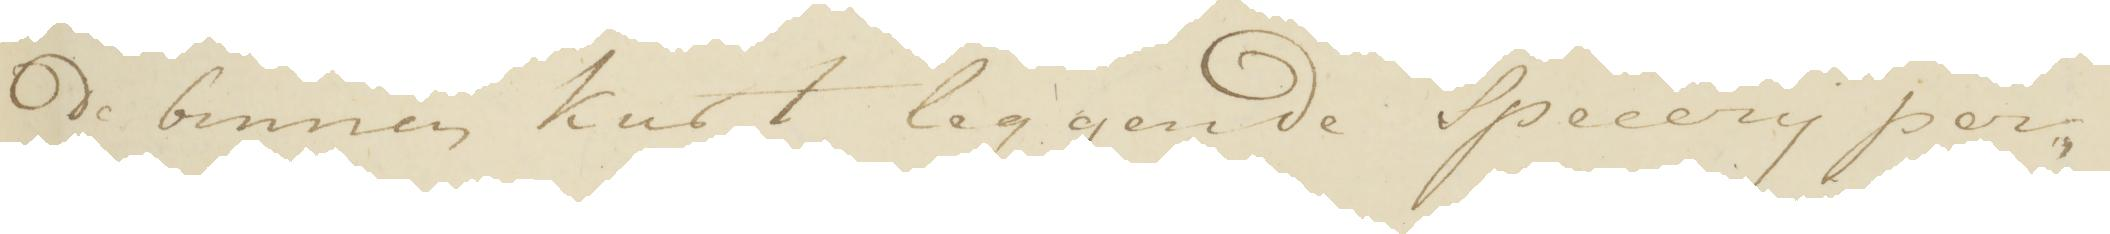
de binnen kust leggende specerij per„
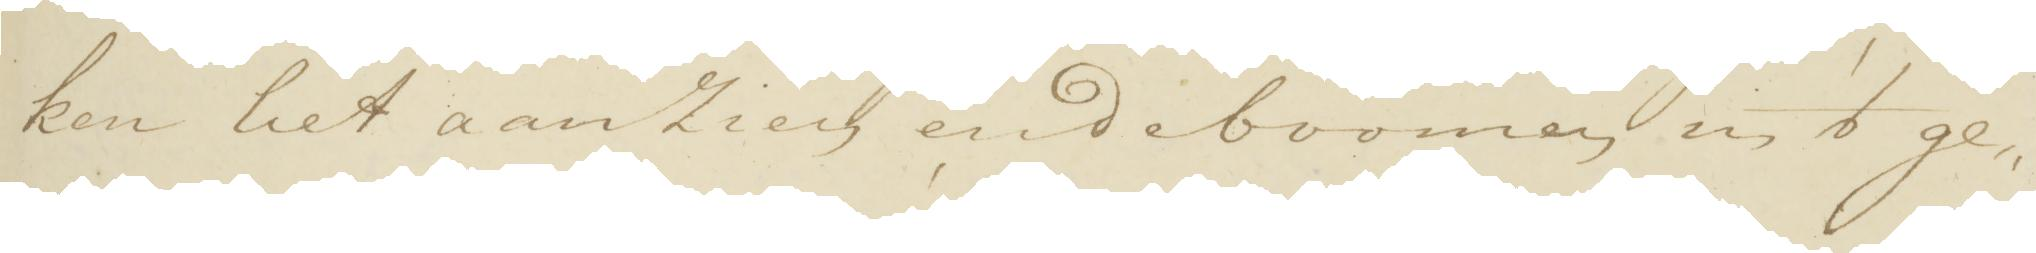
ken het aanzien en de boomen in ’t ge„
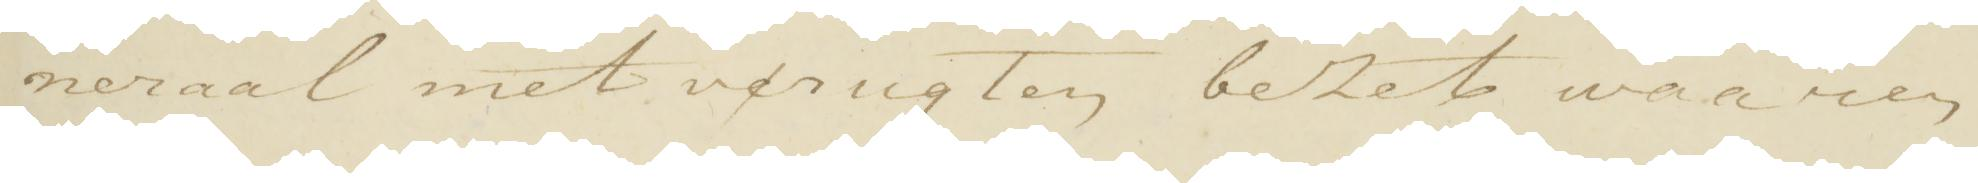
neraal met verugten bezet waaren
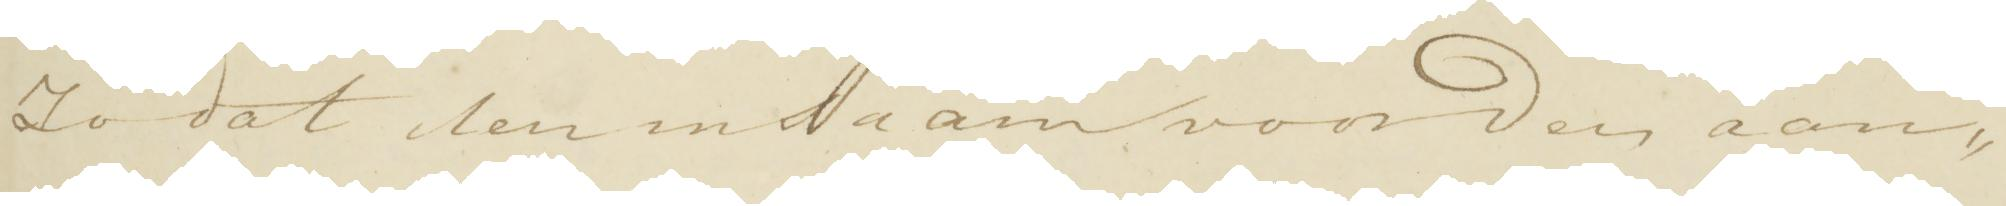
zo dat den insaam voor den aan„
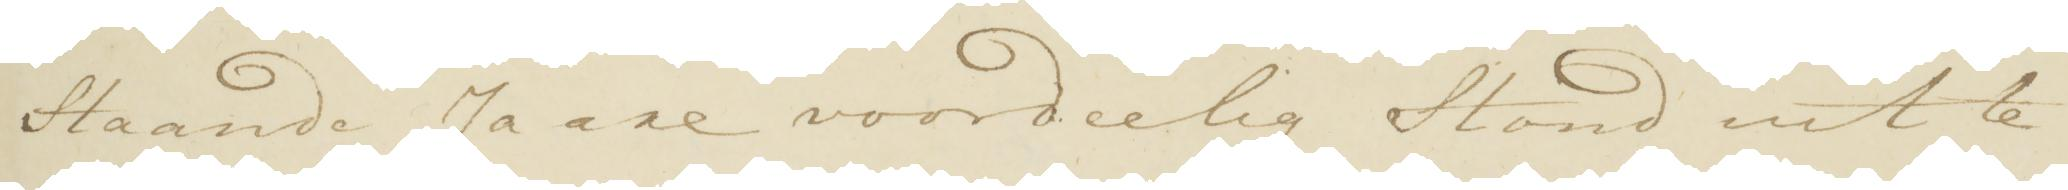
staande Jaare voordeelig stond uit te
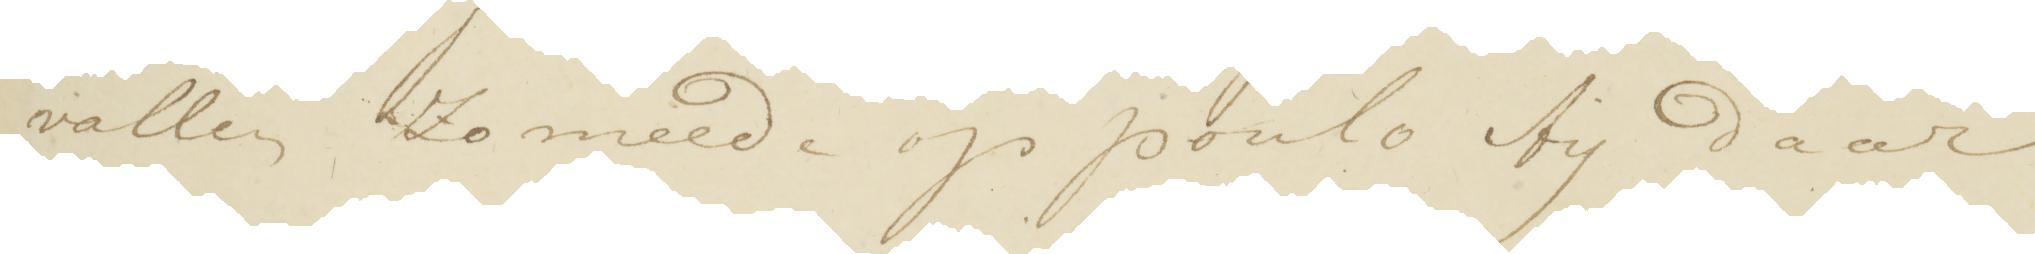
vallen zo meede op ponlo tij daar
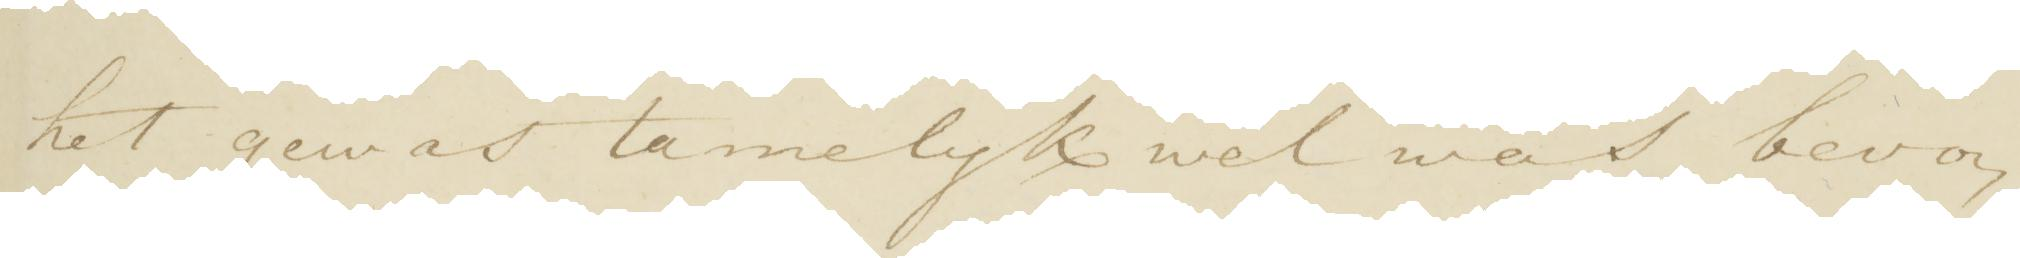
het gewas tamelyk wel was bevon
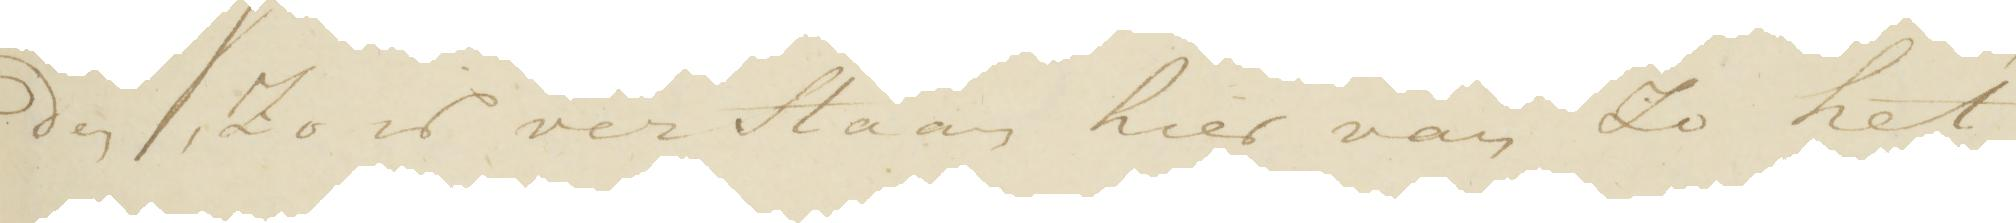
den, zo is verstaan hier van zo het
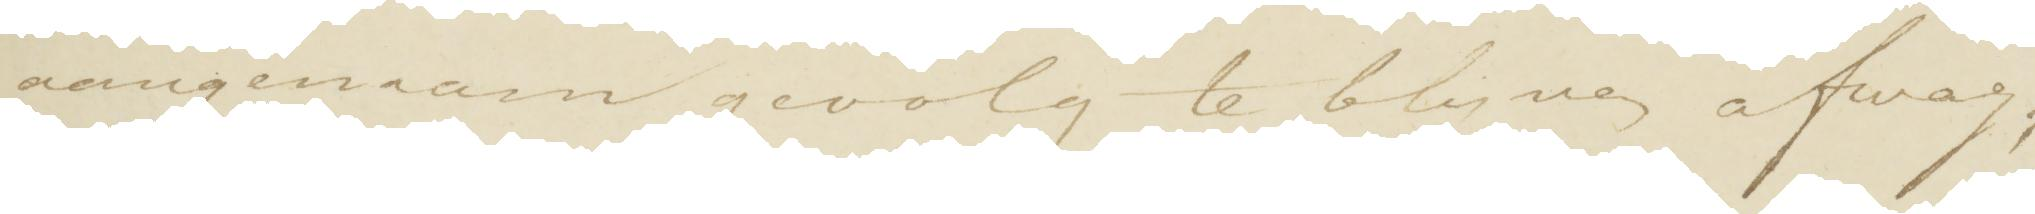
aangenaam gevolg te blijven afwag„
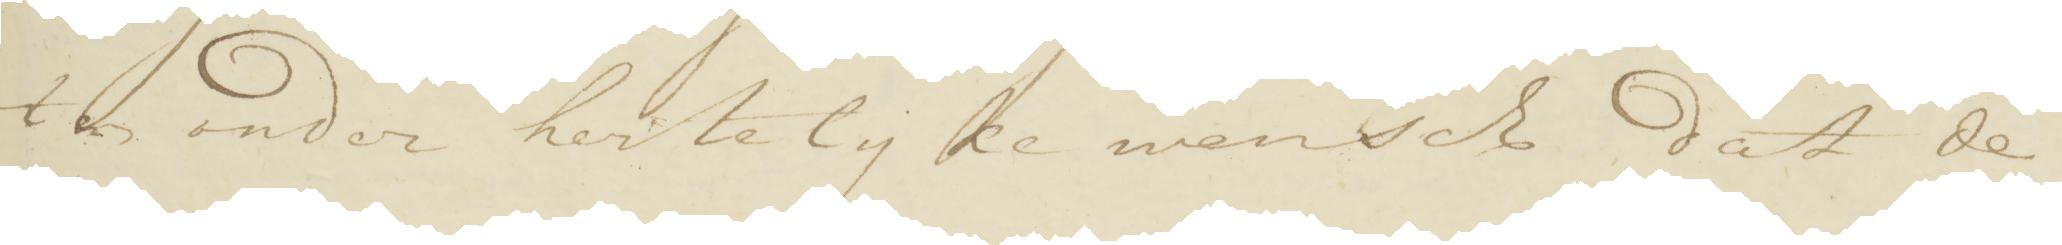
ten onder hertelijke wensch dat de
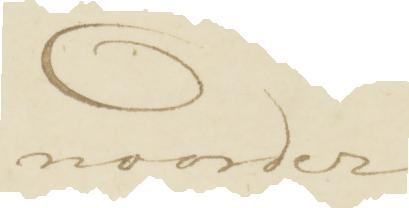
noorder
